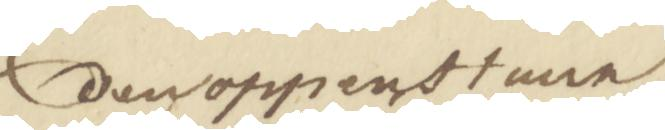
den oppenstuur
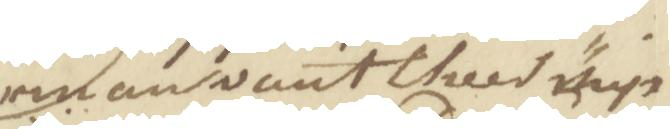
man vant theeschip
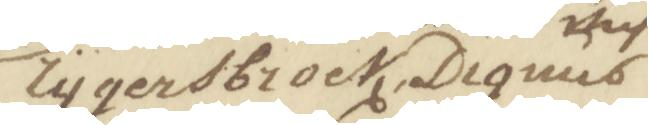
rijgersbroek Dignus
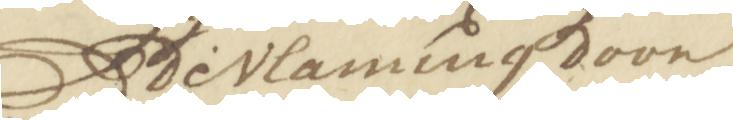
de vlaming door
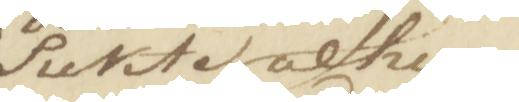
siekte alhier
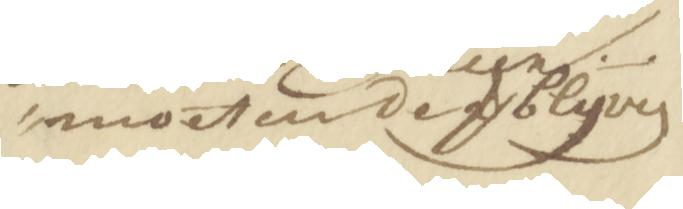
moetende verblijven
